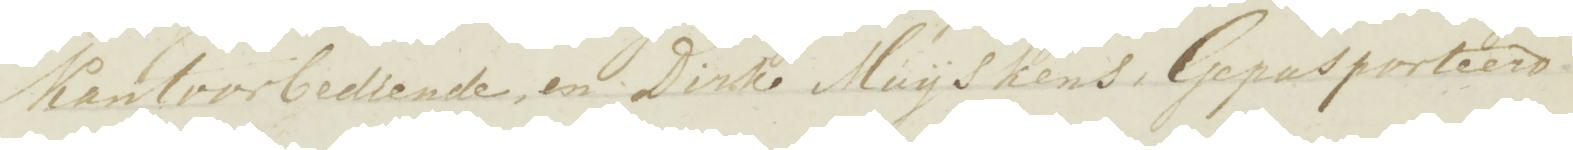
Kantoorbediende, en Dirk Muijskens, Gepasporteerd
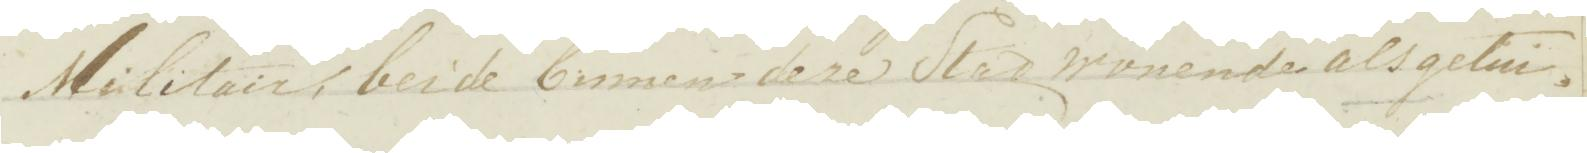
Militair, beide binnen deze stad wonende als getui„
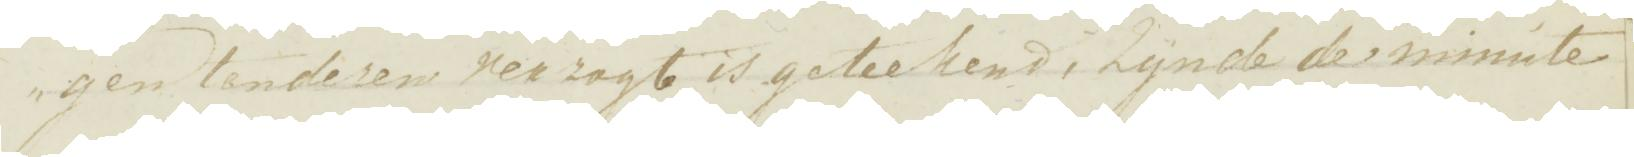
„gen ten dezen verzogt is geteekend, zijnde de minute
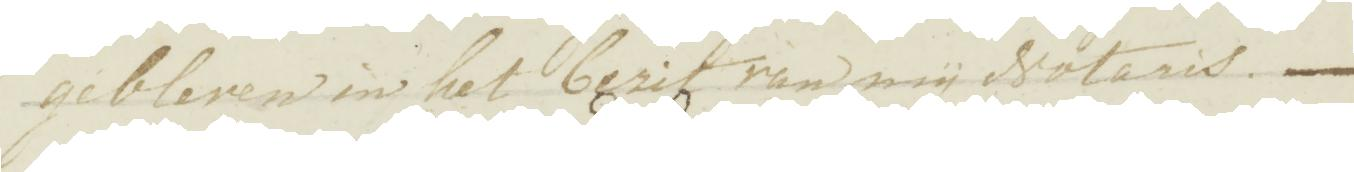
gebleven in het bezit van mij Notaris.
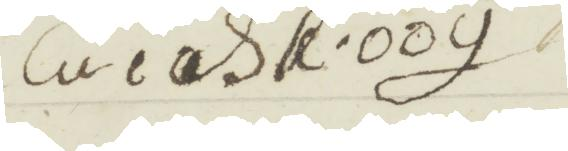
lucas kooy
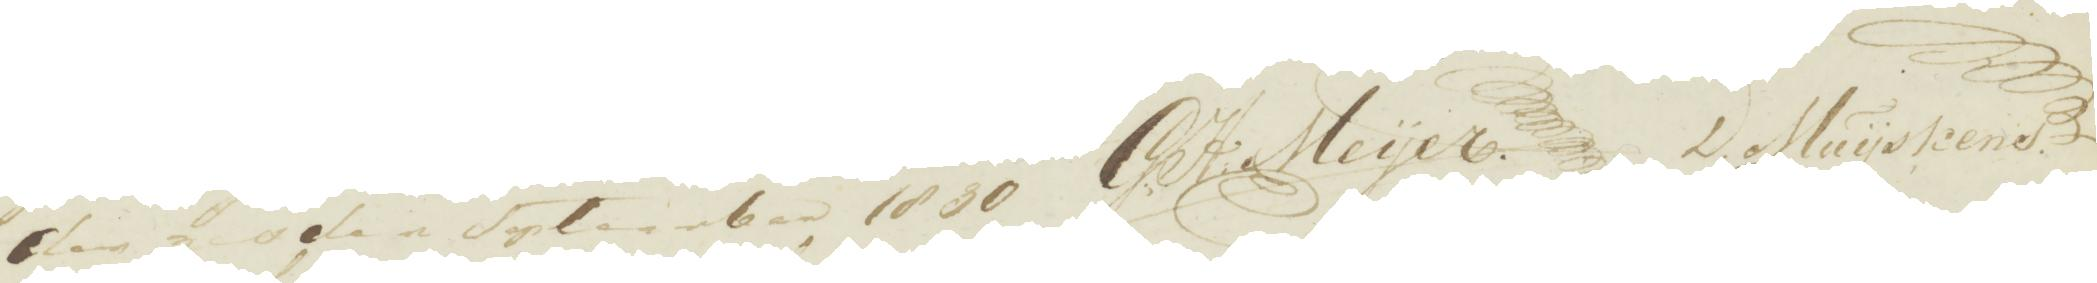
den Zesden September 1830 G.H. Meijer. D. Muijskens.
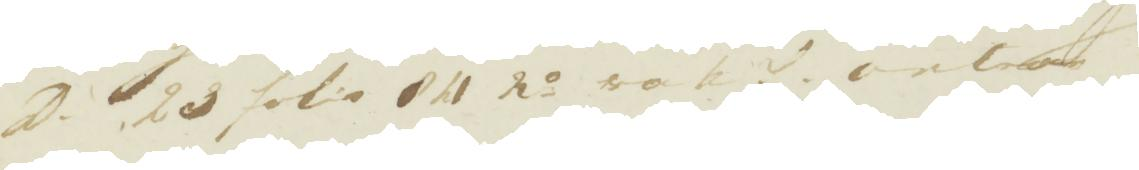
D: 23. folio 84 N=o vak 7. ontvan
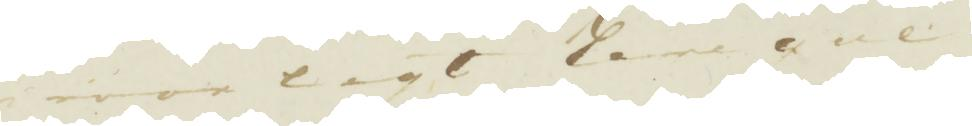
gen voor regt Eene guld
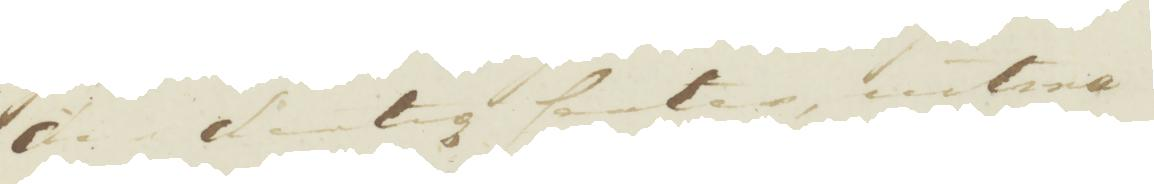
den dertig Centen, en tre
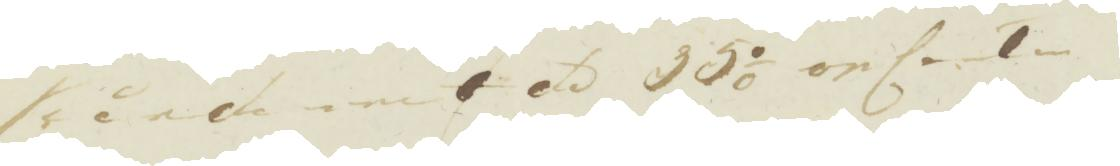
kenden met de 35% op Centen
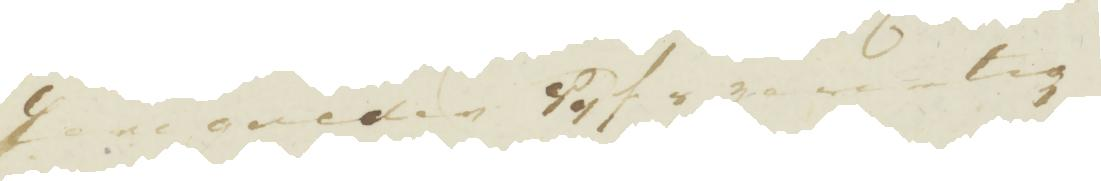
Eene gulden Vijf en zeventig
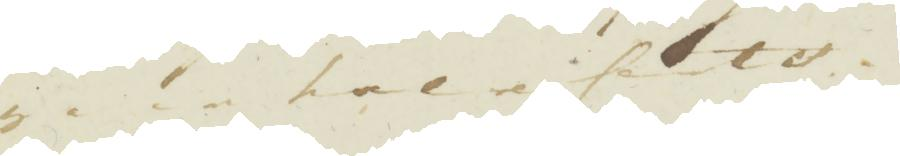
en een halve Cents.
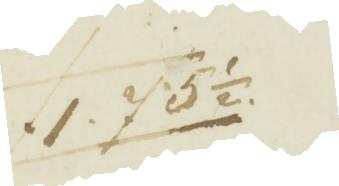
ƒ1. 75½.
